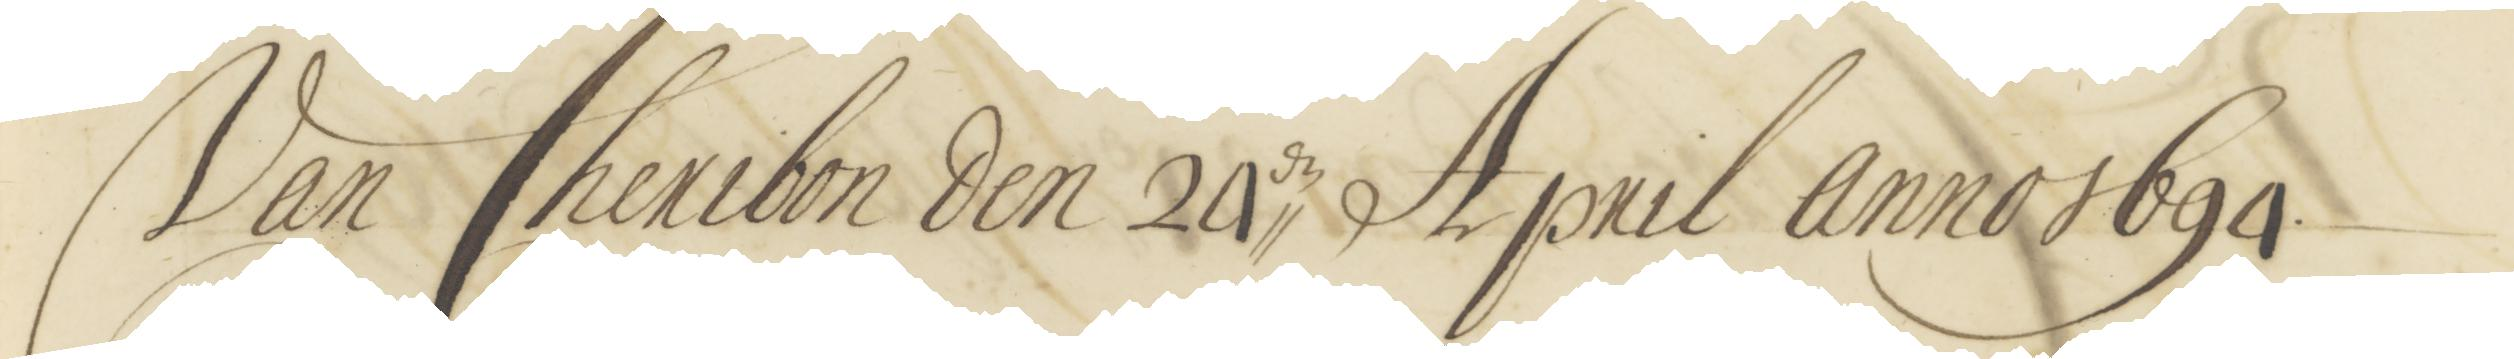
Van Cheribon den 24„en April anno 1694. —
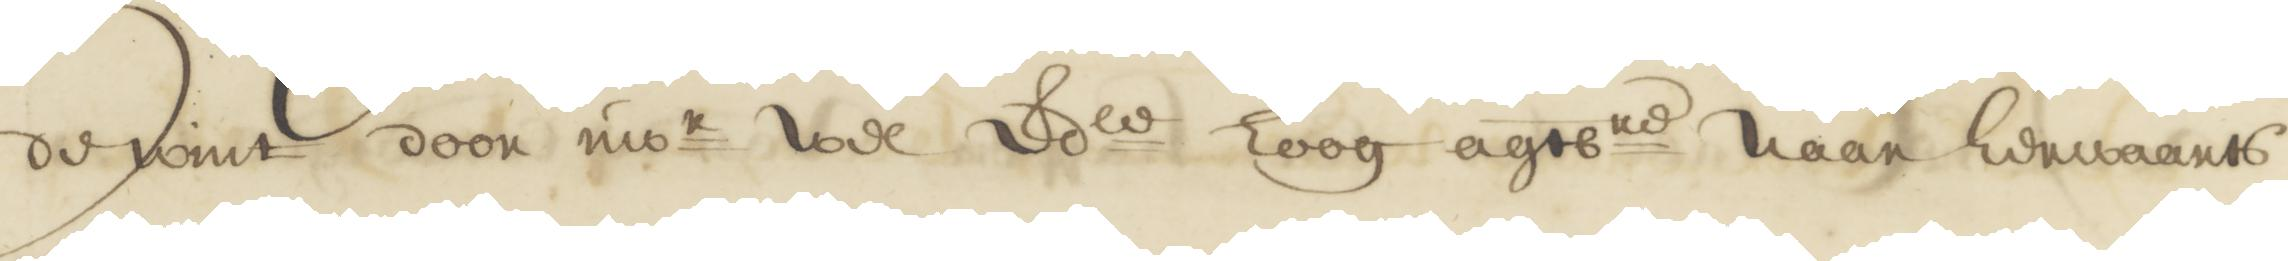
de wint door uw=r Wel Ed=le hoog agtb=re Naar herwaarts
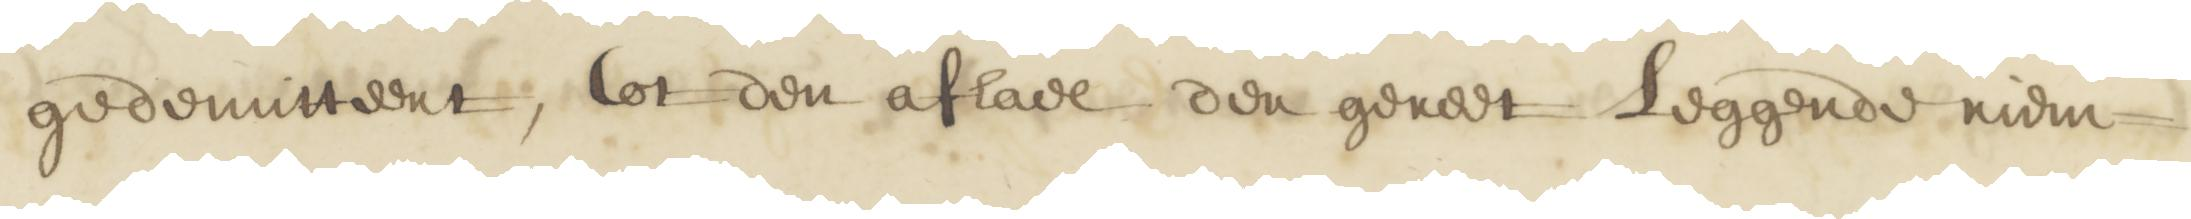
gedemitteert, tot den afhael der gereet leggende riem=
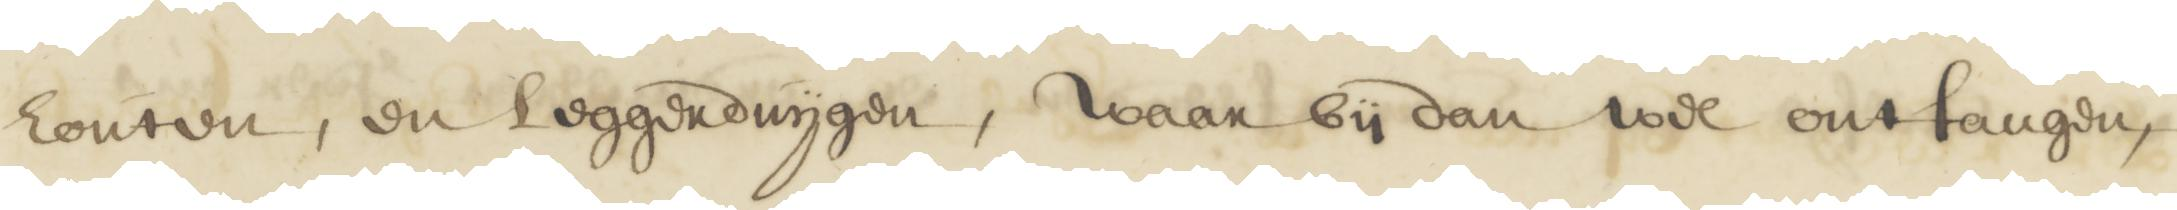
houten, en leggerduijgen, Waar bij dan wel ontfangen,
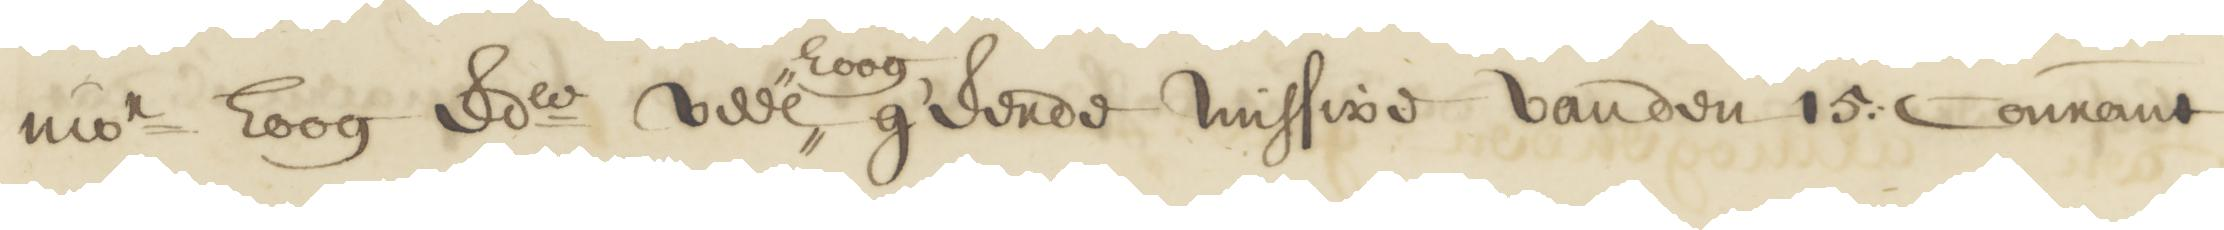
uw=r hoog Ed=le veel hoog g’Eerde Missive Vanden 15: courant
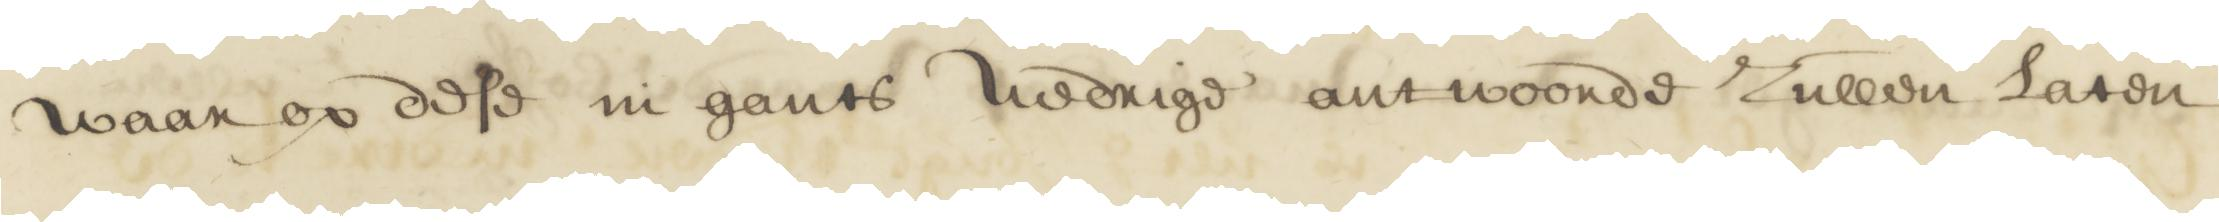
Waar op dese in gants Nedrige antwoorde zullen laten
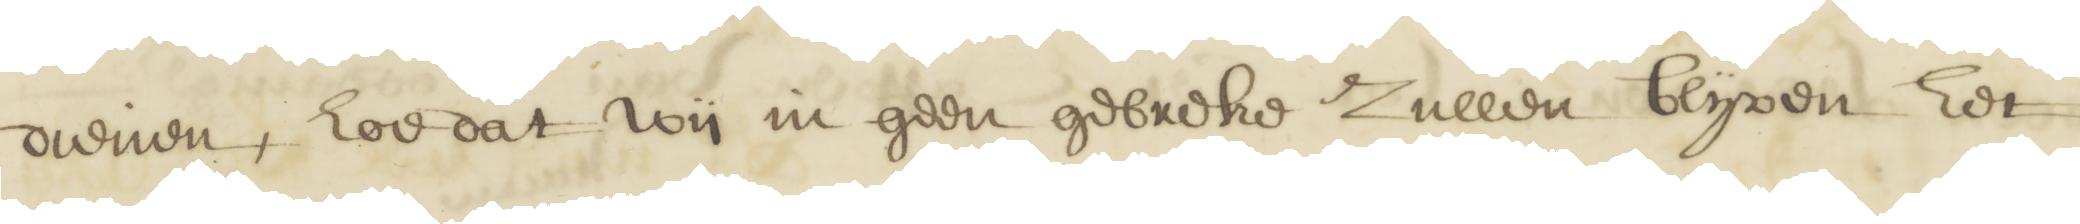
dienen, hoe dat wij in geen gebreke zullen blijven het
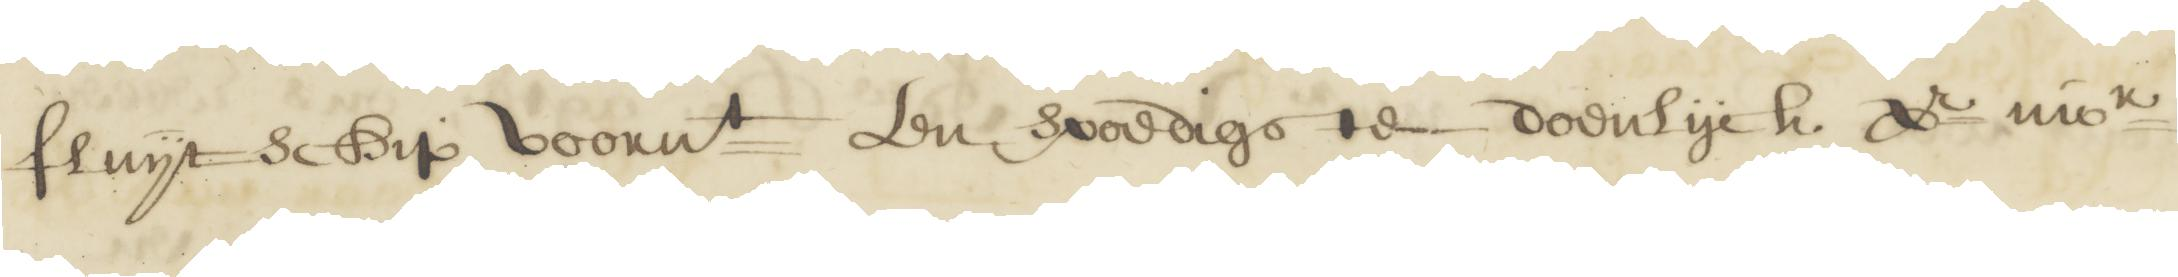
fluijt schip Voorn=t ten spoedigste doenlijck p=r uw=r
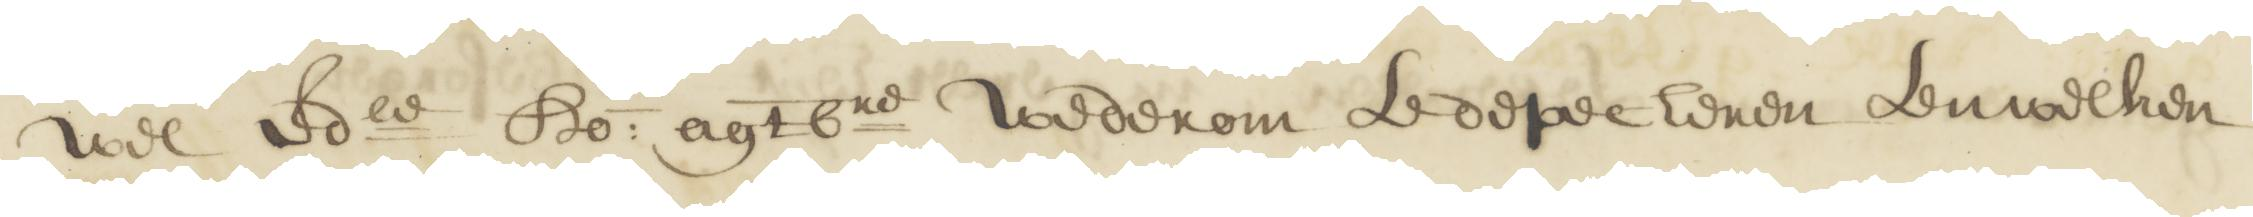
wel Ed=le Ho: agtb=re Wederom tedepecheren tenwelken
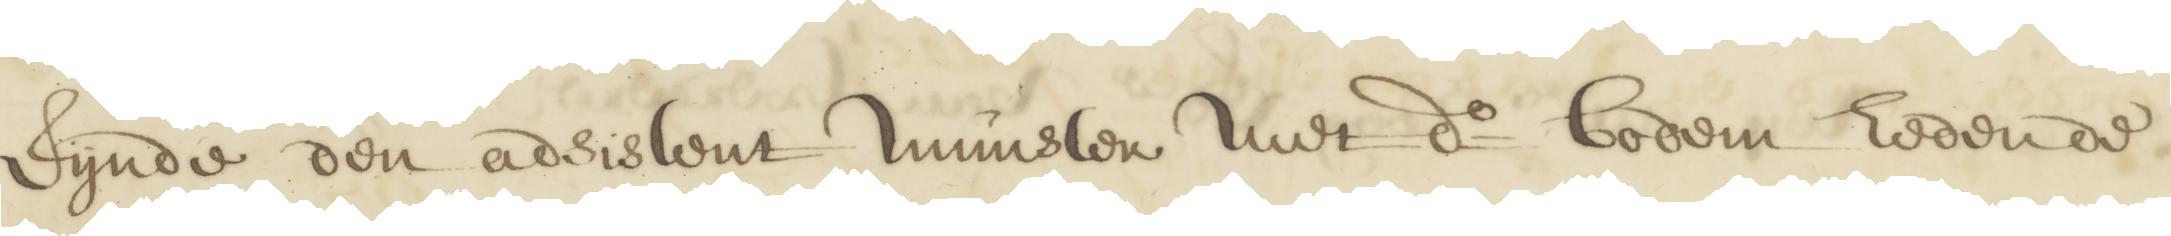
Eijnde den adsistent Munster Met d=o bodem hedende
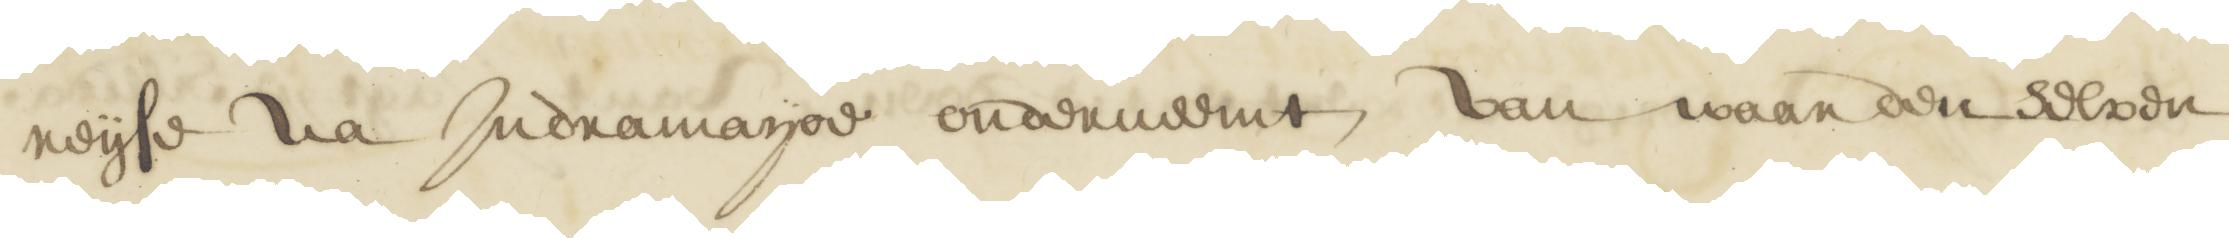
reijse Na Jndramaijoe onderneemt, Van waar den selven
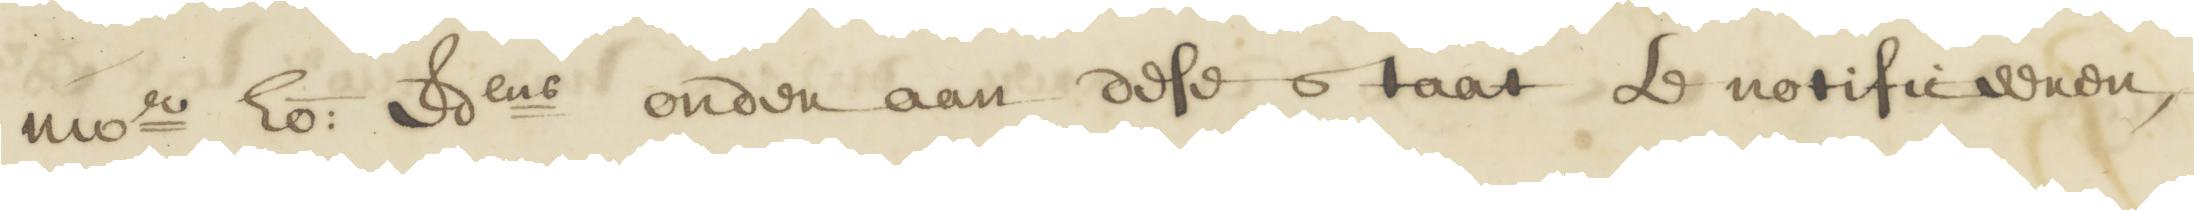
uw=er ho: Ed=ens onder aan dese staat te notificeeren,
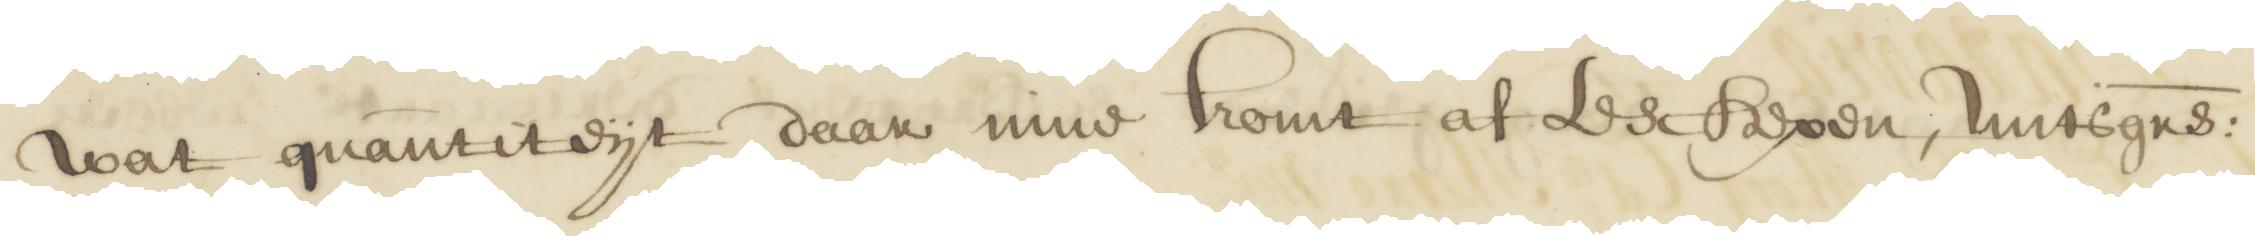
Wat quantiteijt daar inne komt af teschepen, Mitsgrs:
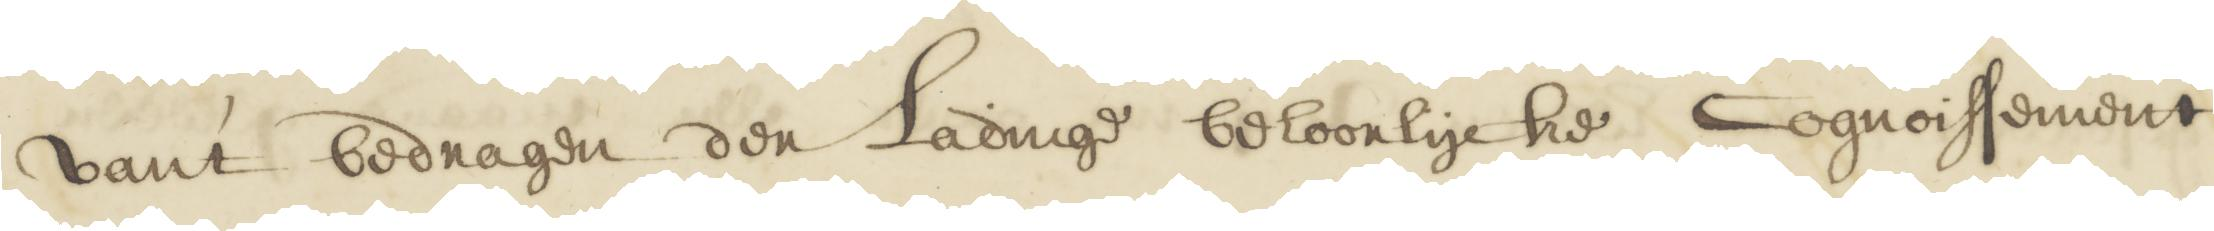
van’t bedragen der Ladinge behoorlijcke cognoissement
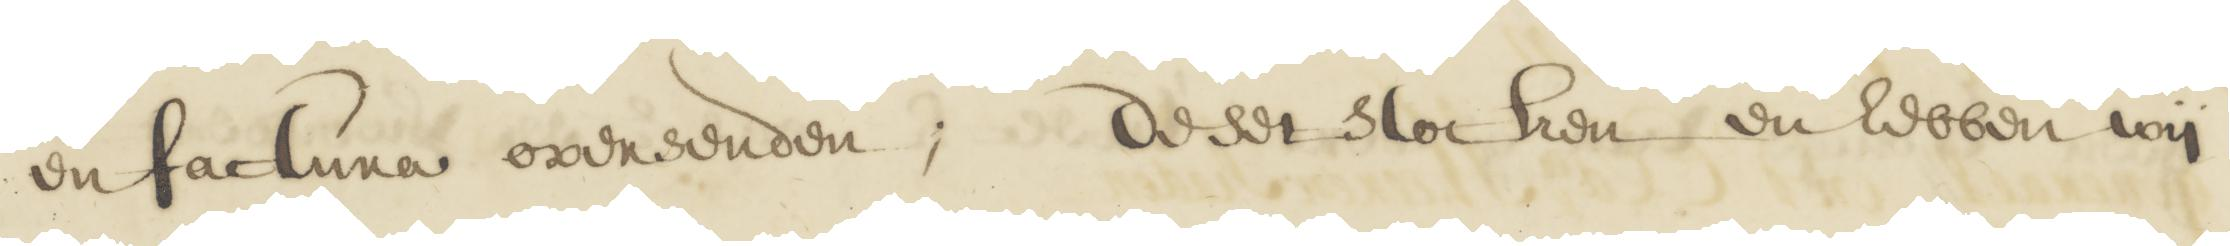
en factura oversenden; de eetstocken en hebben wij
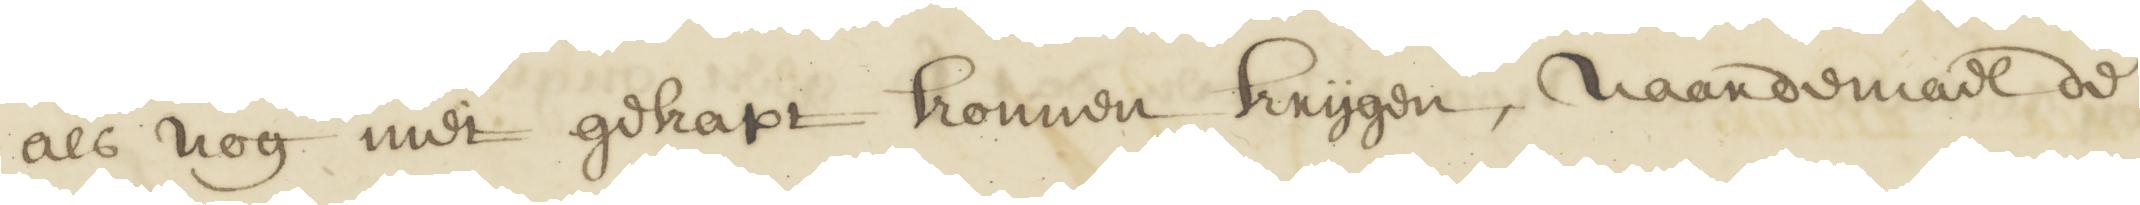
als nog niet gekapt konnen krijgen, Naardemael de
